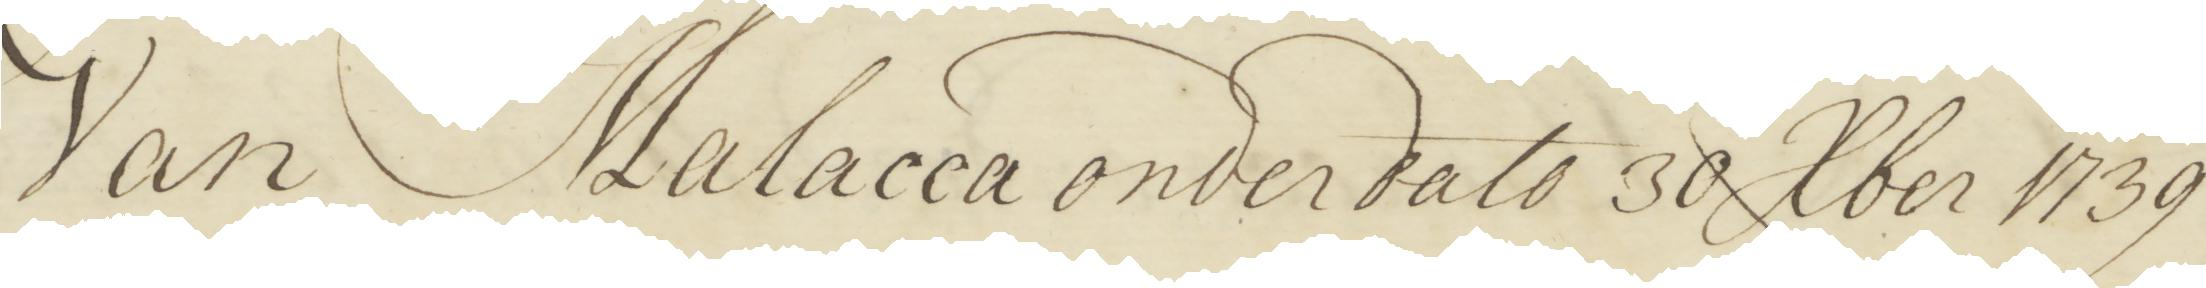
Van Malacca onder dato 30. Xber 1739
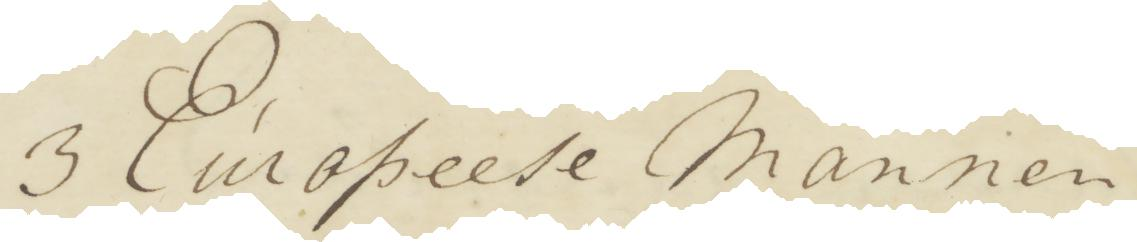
3 Europeese mannen
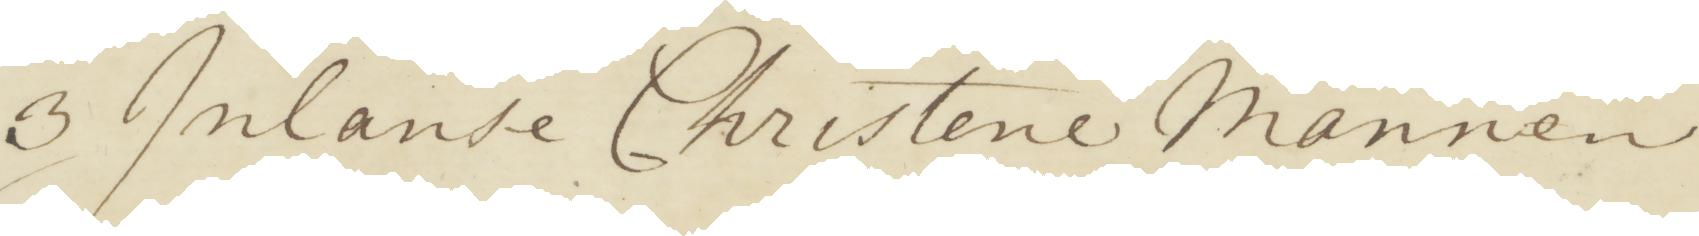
3 Jnlanse Christene mannen
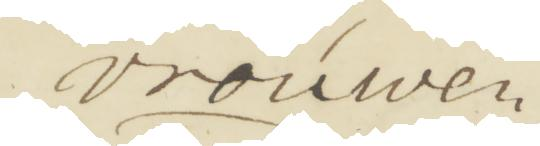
3 _=o _=o vrouwen
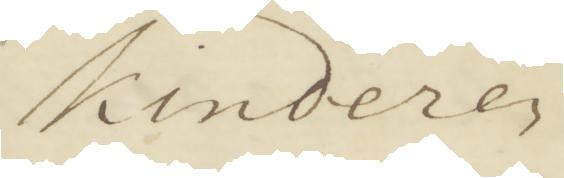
10 _=o _=o kinderen
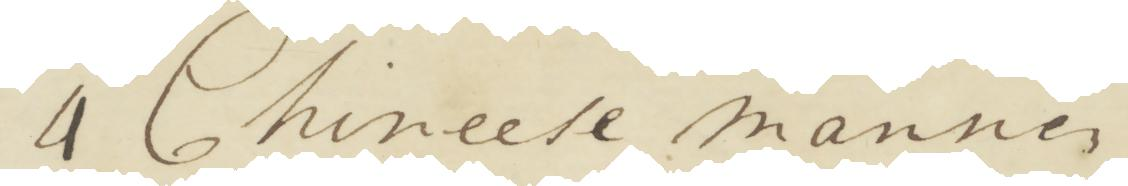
4 Chineese mannen
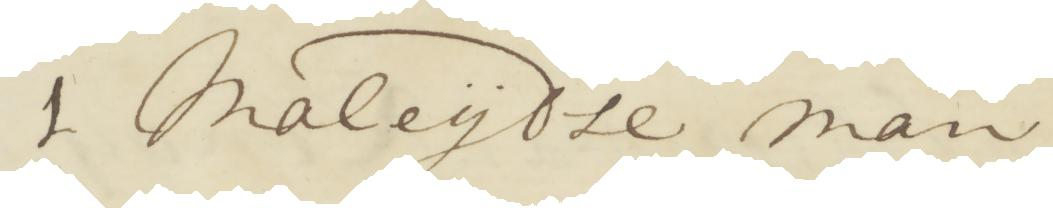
1 maleijdse man
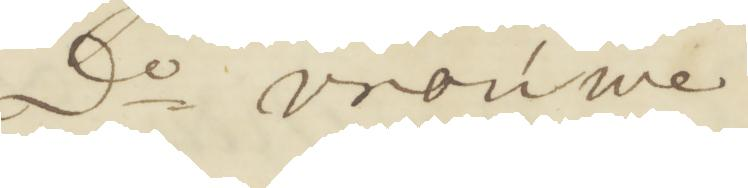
2 _=o vrouwe
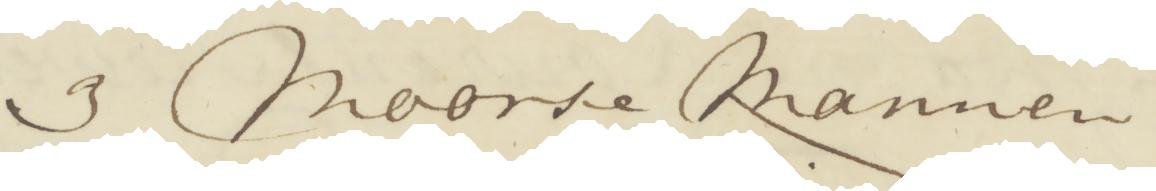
3 moorse mannen
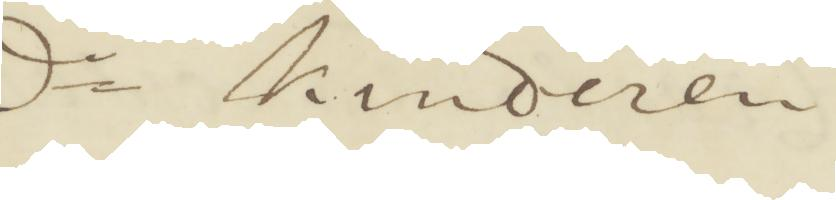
2 _=o kinderen
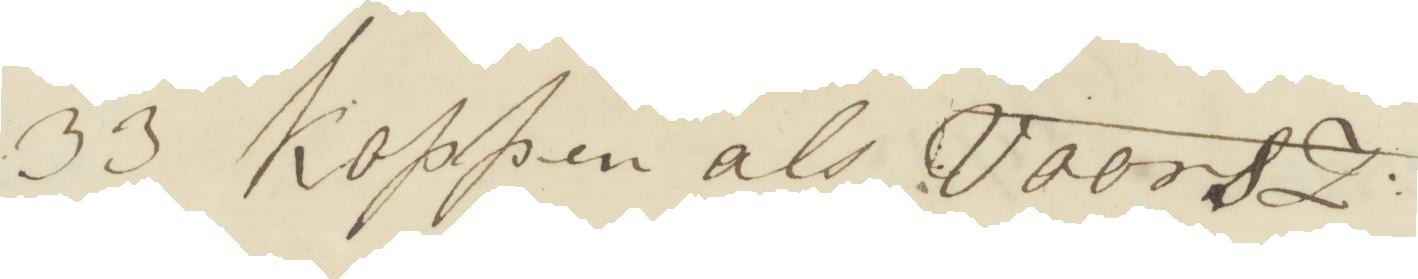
33 koppen als voorsz:
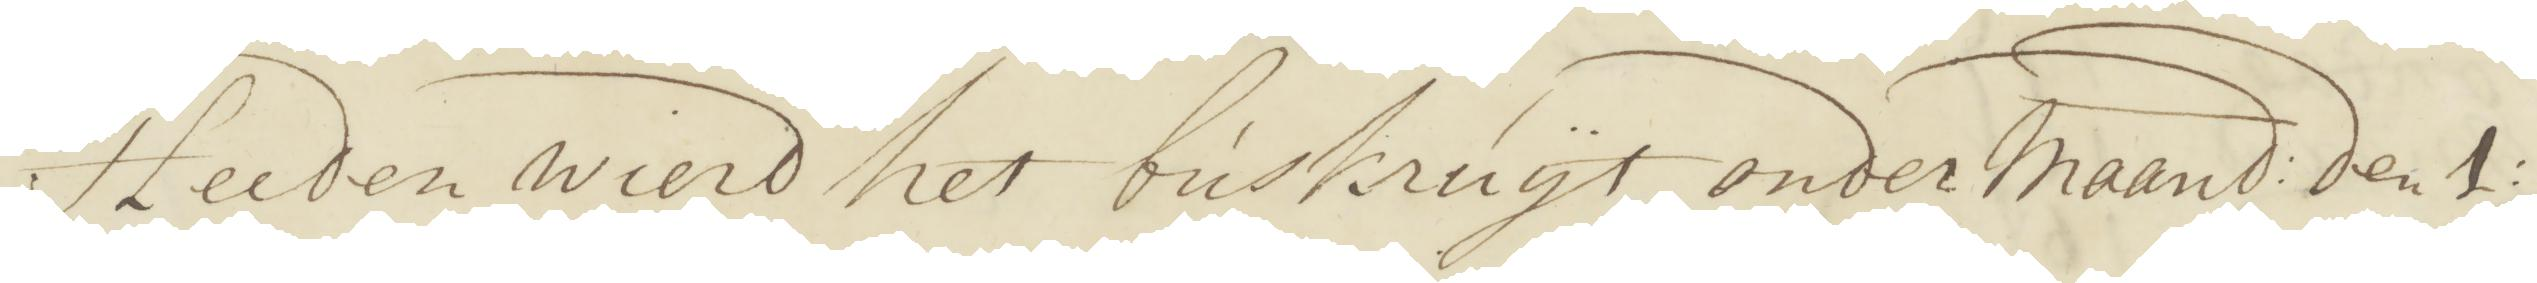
Heeden wierd het buskruijt onder maand: den 1:
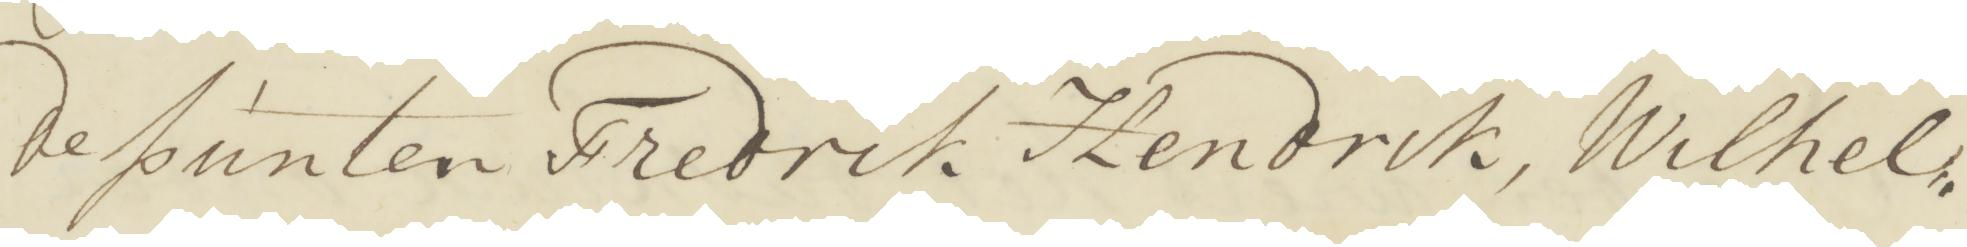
de punten Fredrik Hendrik, Wilhel„
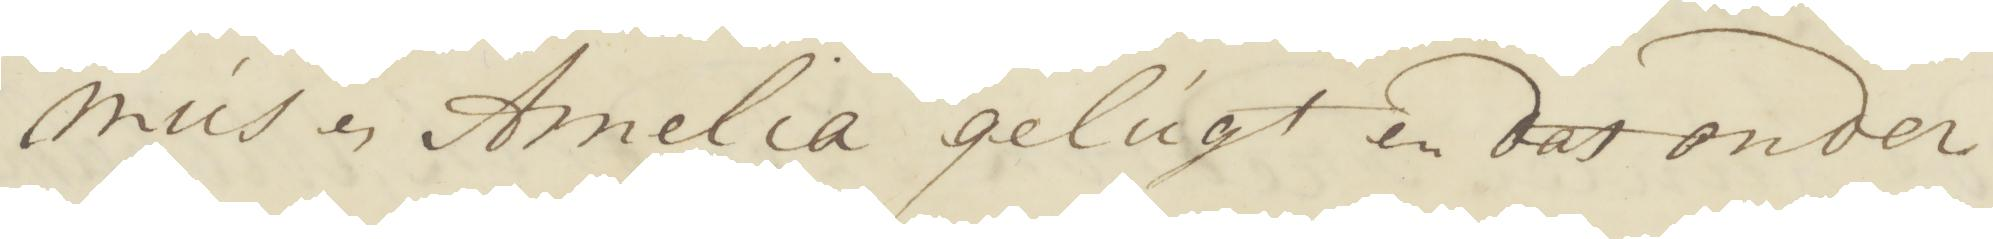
mus en Amelia gelugt en dat onder
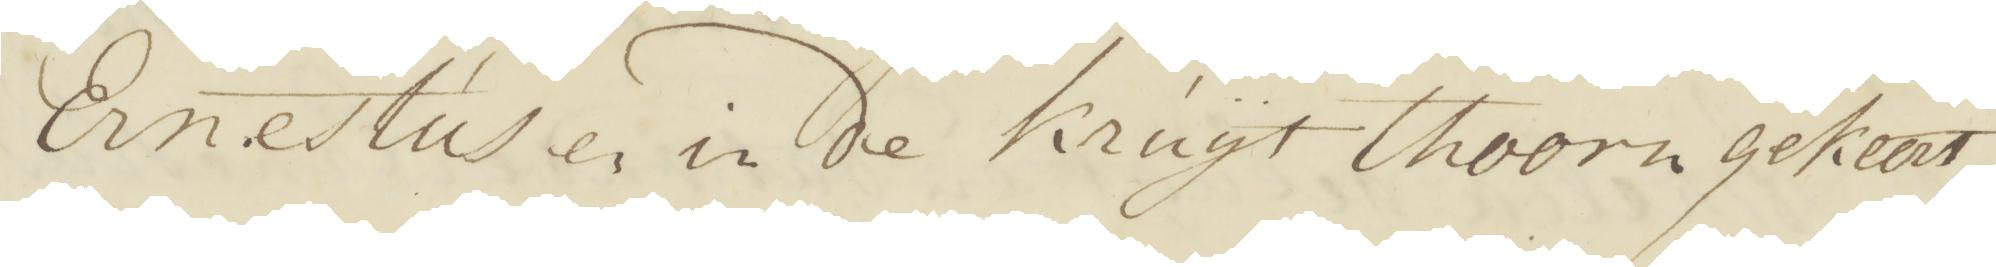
Ernestus en in de kruijt thoorn gekeert
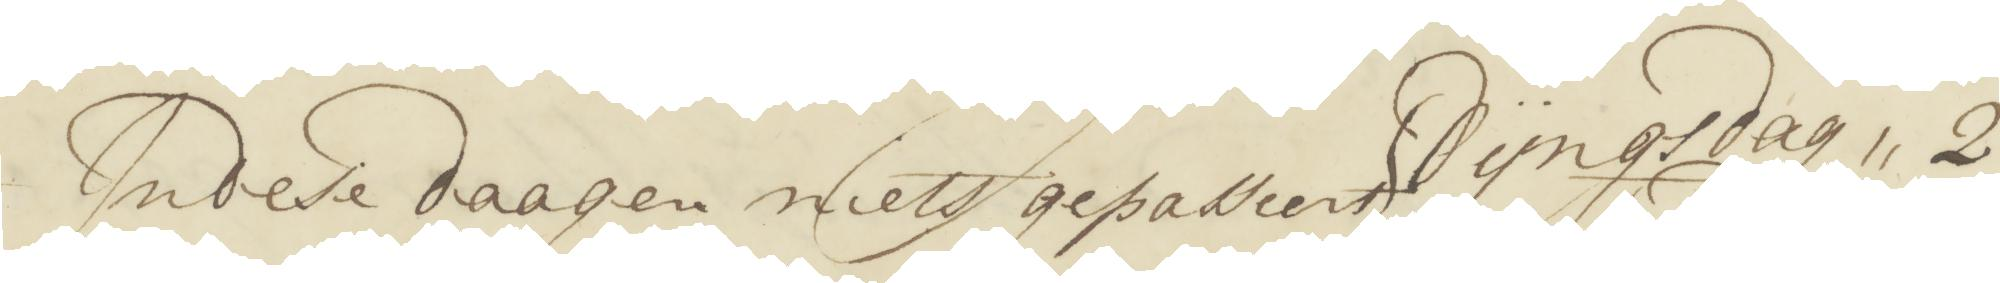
Jn dese daagen niets gepasseert dijngsdag „ 2
